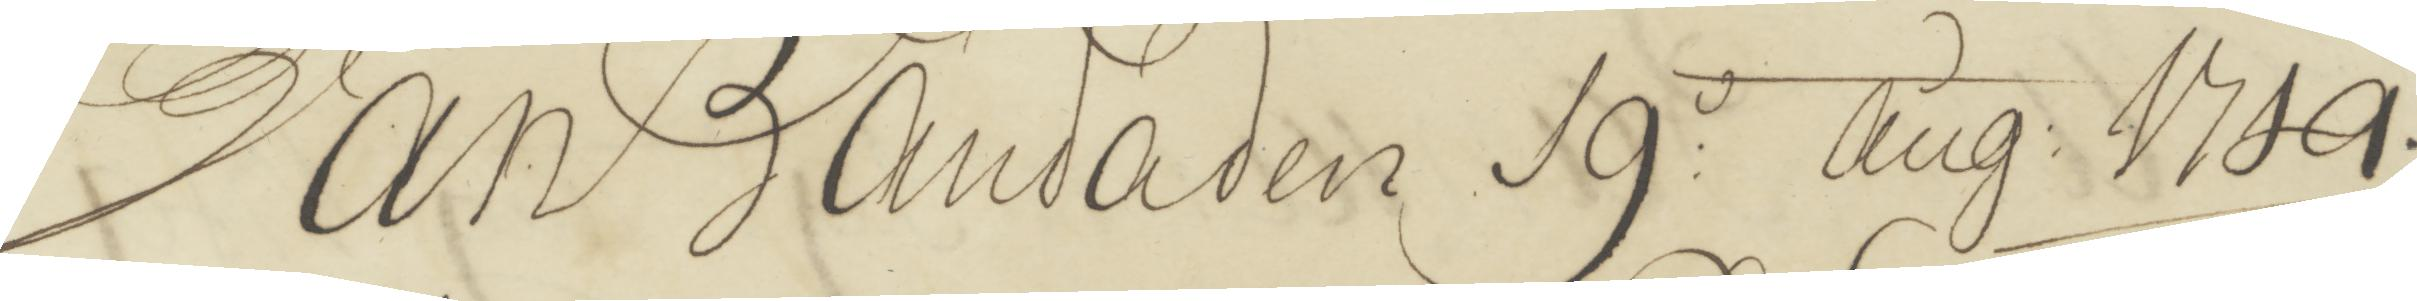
Van Banda den 19:' aug: 1714
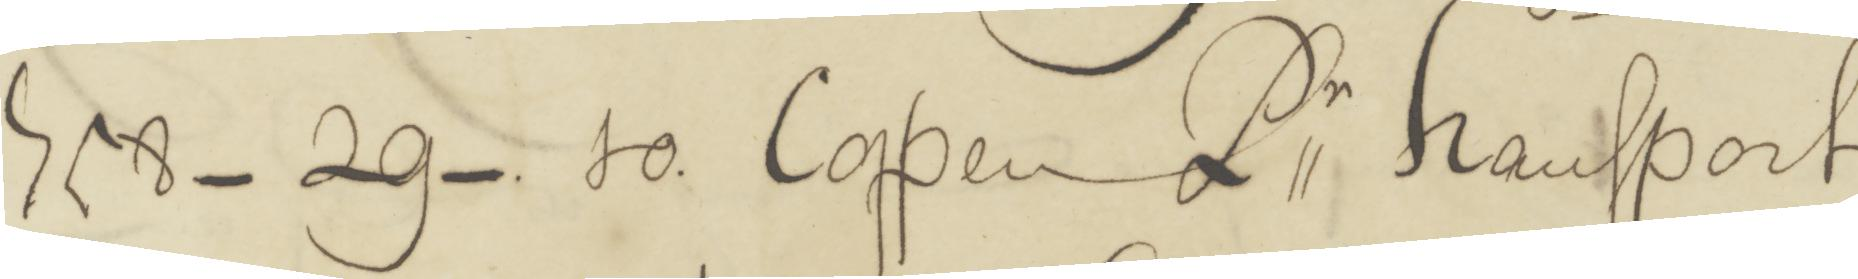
758 – 29–. 10. Coppen P„r transport
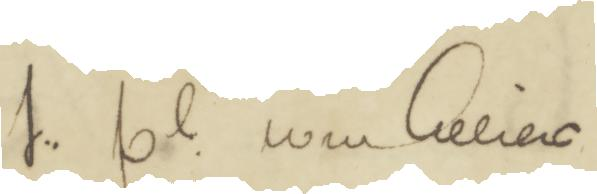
1„ p.l winkelier
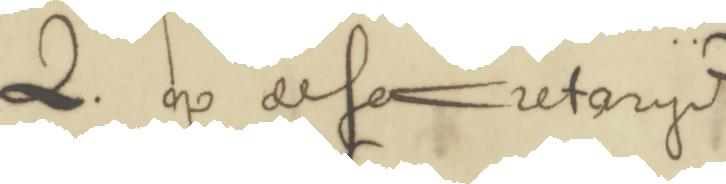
2. op de secretarije
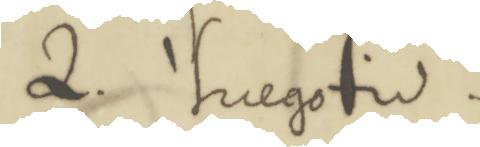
2. 't negotie
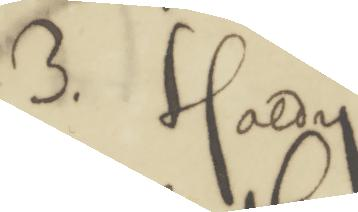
3. tsoldij
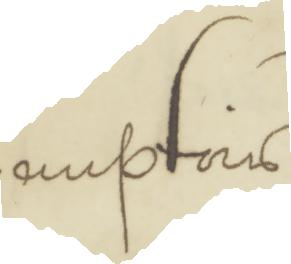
Comptoirs
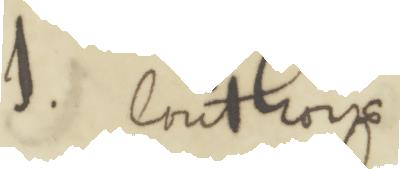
1. lonthoir
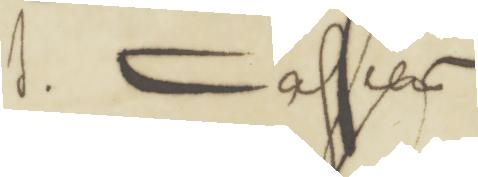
assier
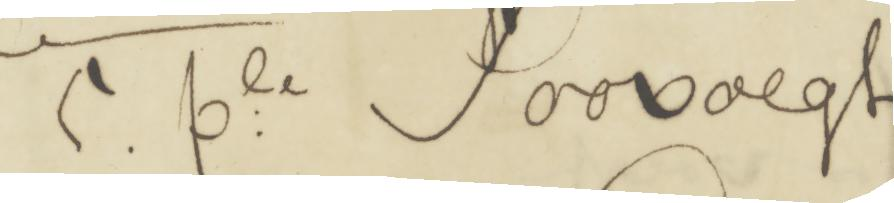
5. p:le Soovoegt
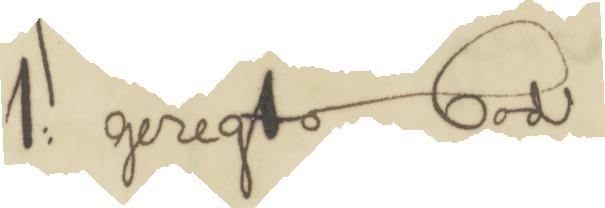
1: geregts bode
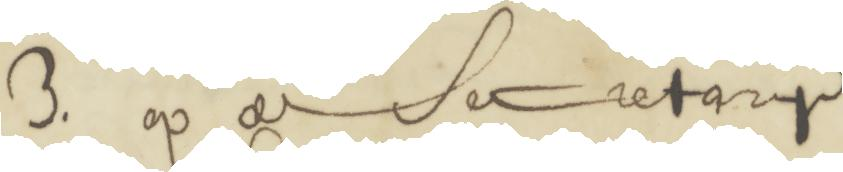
3. op de secretarije
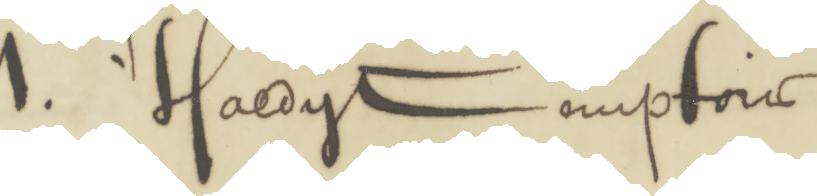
1. 'tsoldij Comptoir
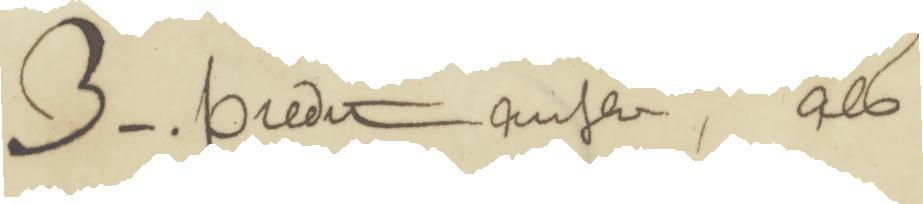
3 – . predicanten, als
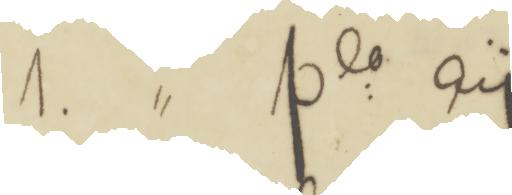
1. „ p:lo aij
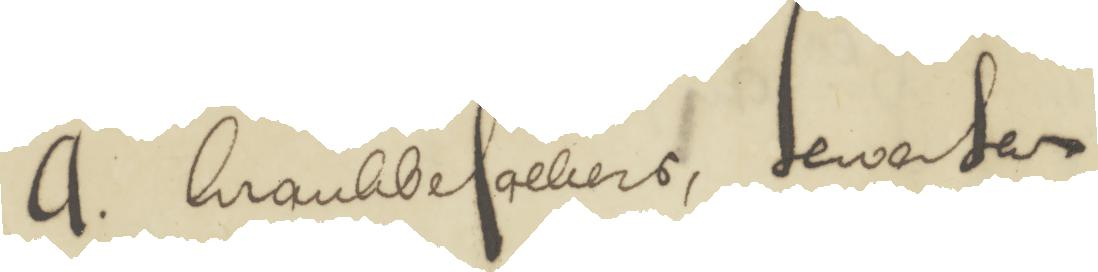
4. krankbesoekers, te weten
